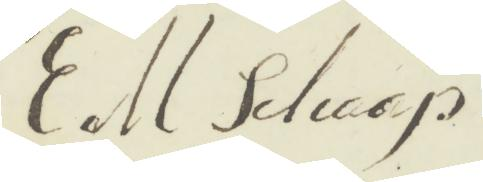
E M Schaap
